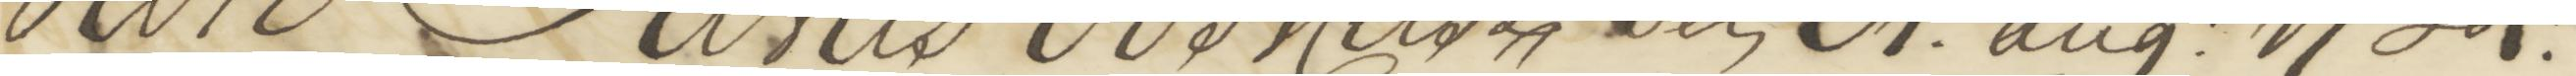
Van Iavas oostcust, den 31: aug: 1734:
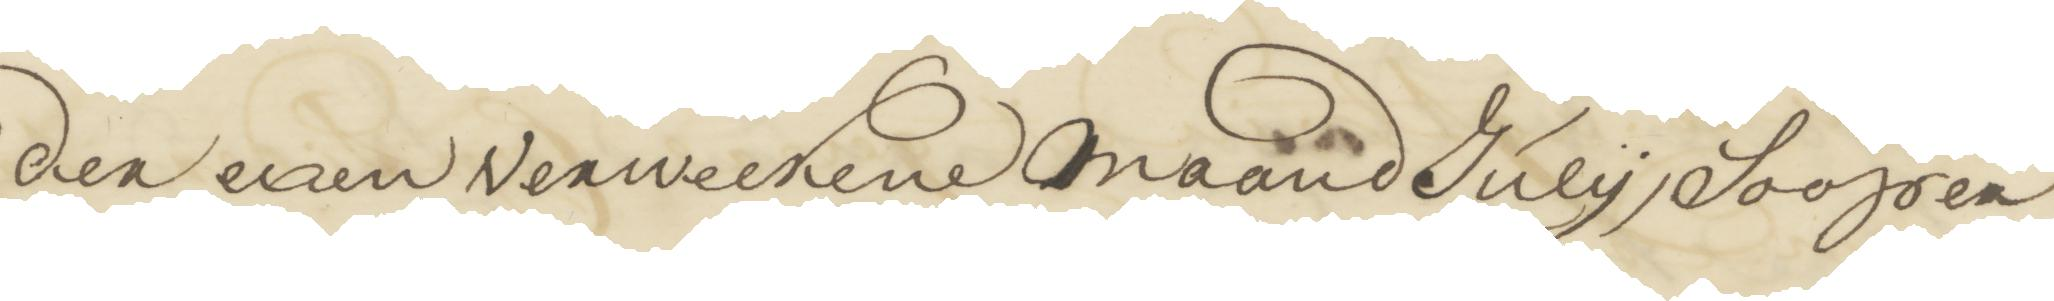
der even verweekene maand Iulij, sooper
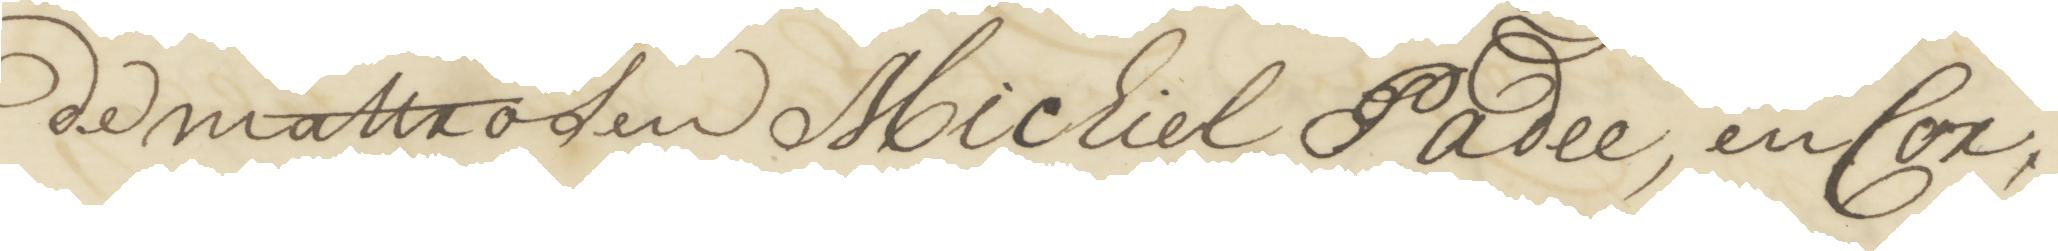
de mattrosen Michiel Padee, en Cor„
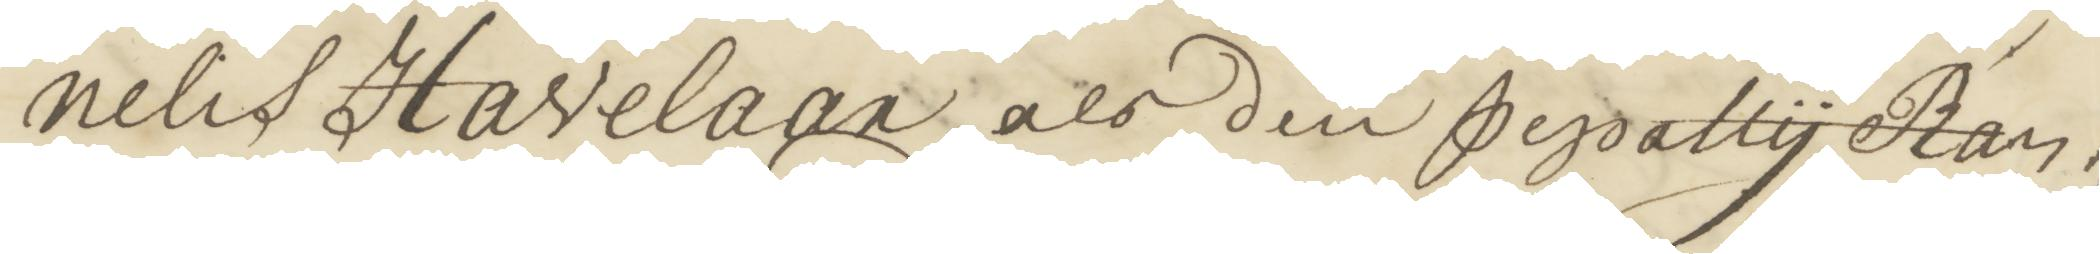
nelis Havelaar, als den pepattij Ran
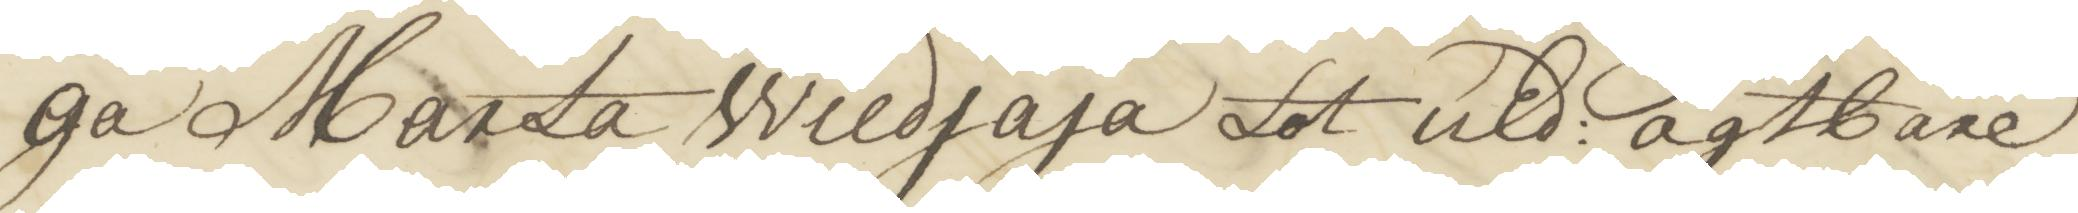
ga Marta Wiedjaja tot uEd: agtbare
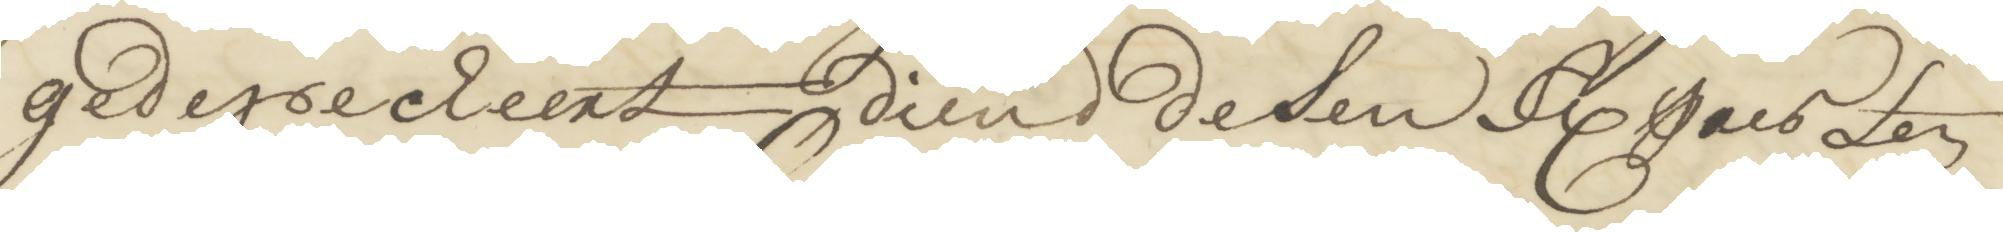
gedepecheert, diend desen Expres ten
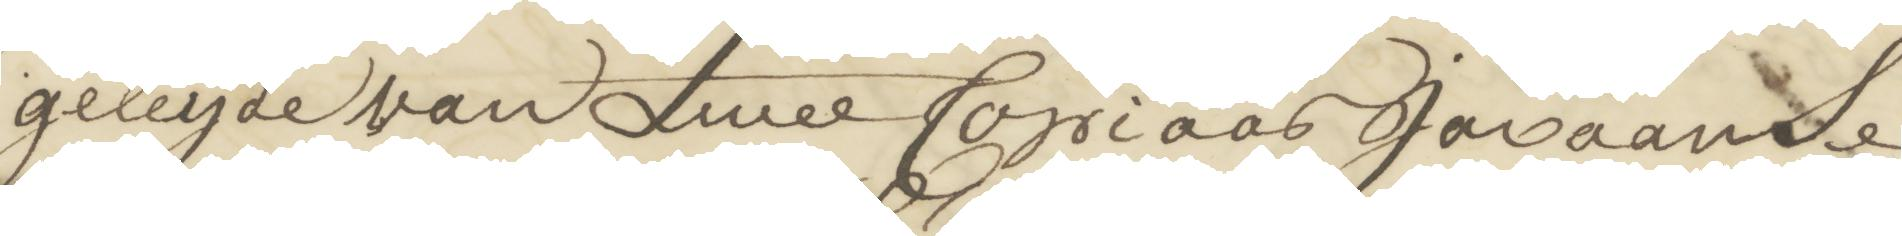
geleijde van twee Copiaas Javaanse
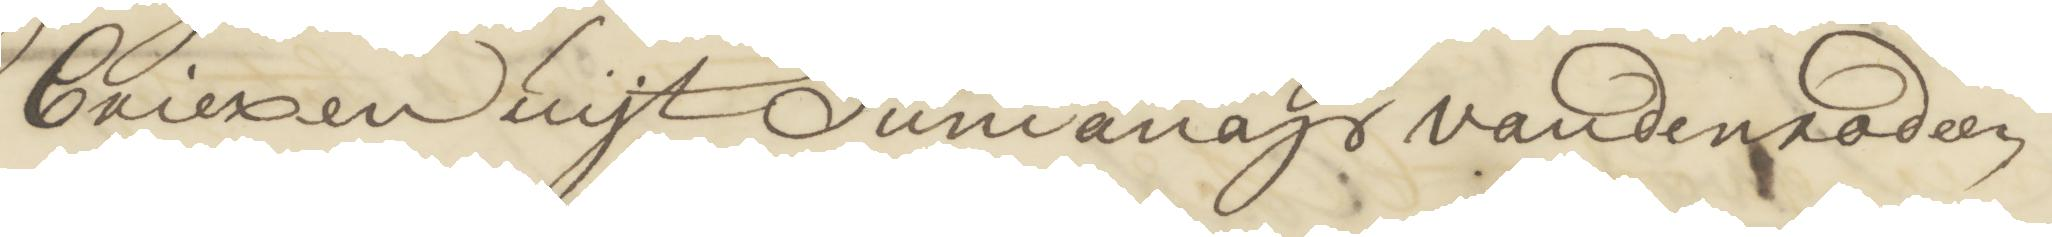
brieven uijt sumanap van denradeen
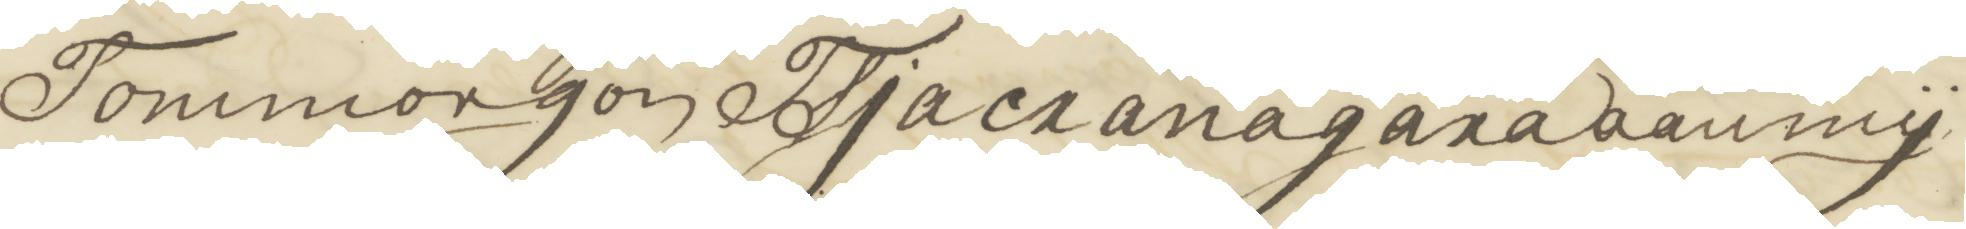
Tommorgon Tsjacranagara aan mij
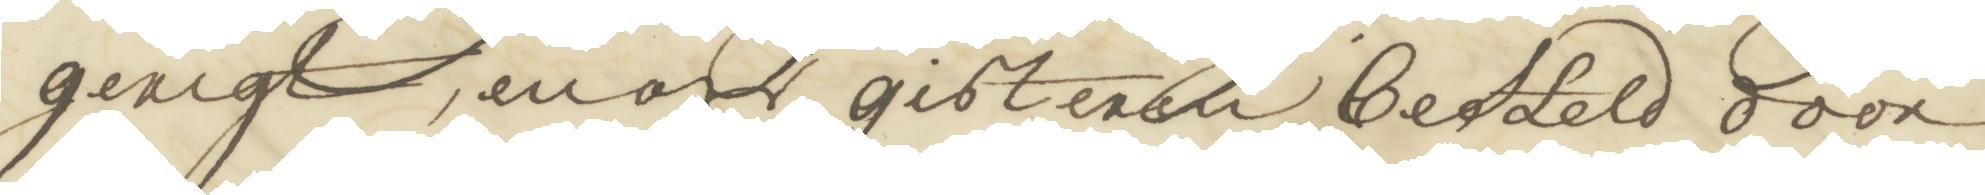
gerigt, en op gisteren besteld door
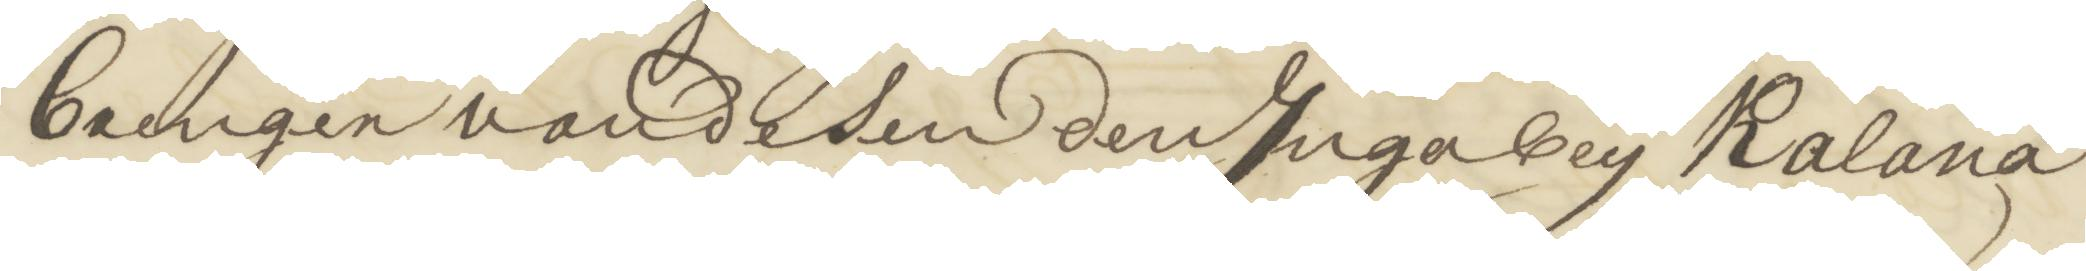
brenger van desen den Jngabeij Kalana
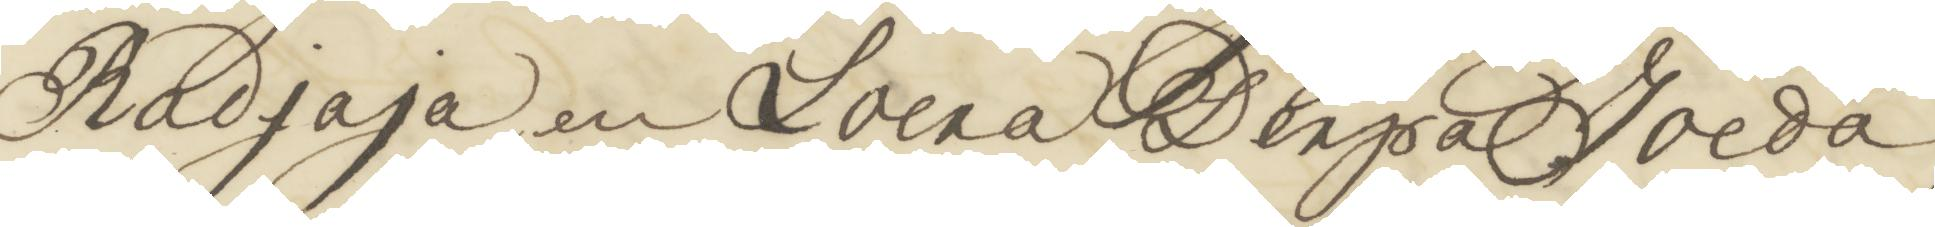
Radjaja en Loera Derpa Joeda
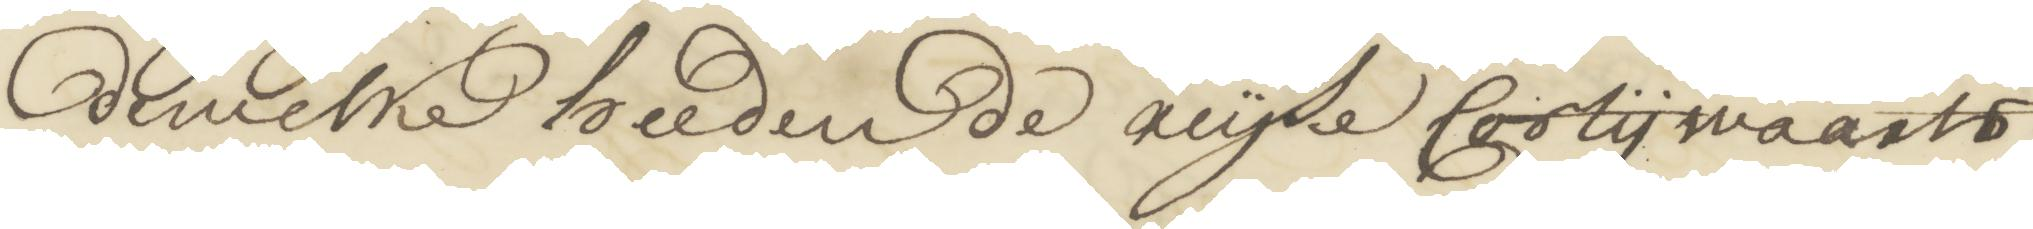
dewelke heeden de reijse Costijwaarts
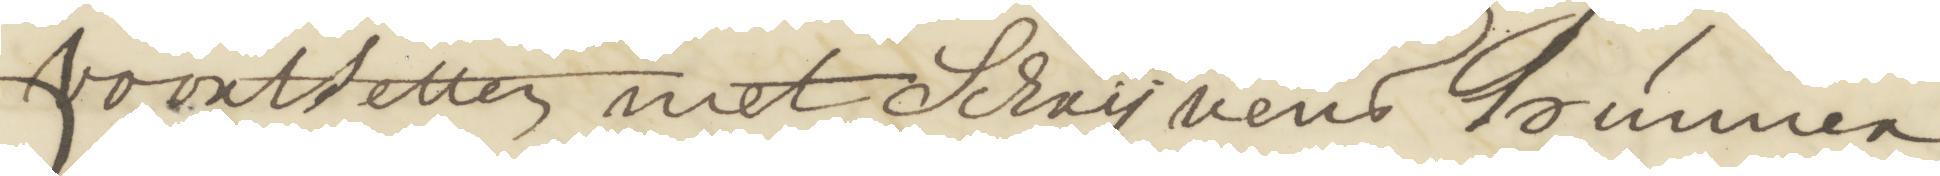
voortsetten met schrijvens hunner
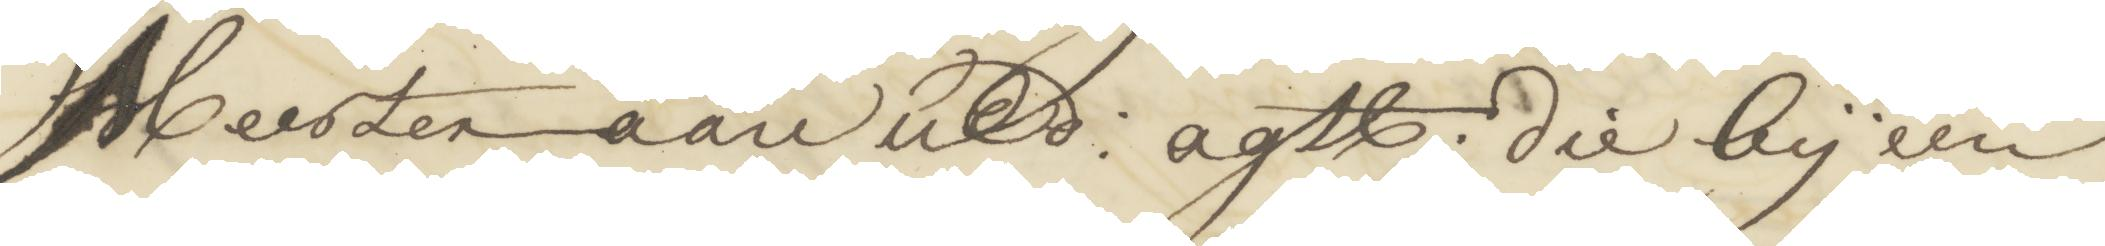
Meester aan uEd: agtb: die bij een
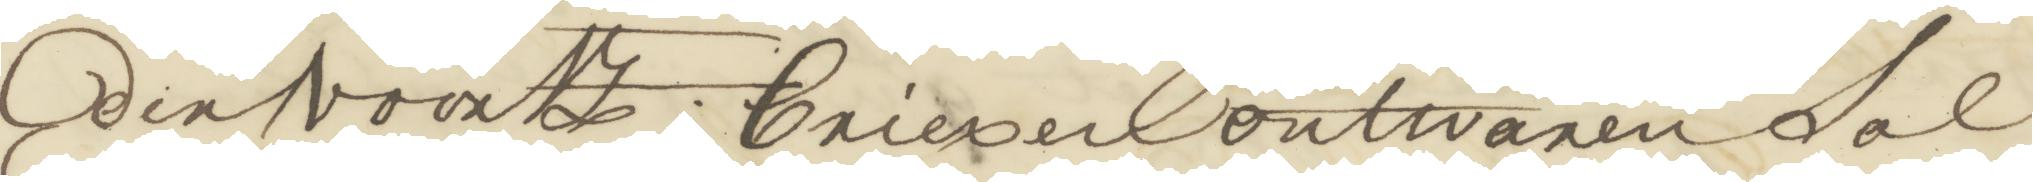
der voorsz: brieven ontwaren sal,
